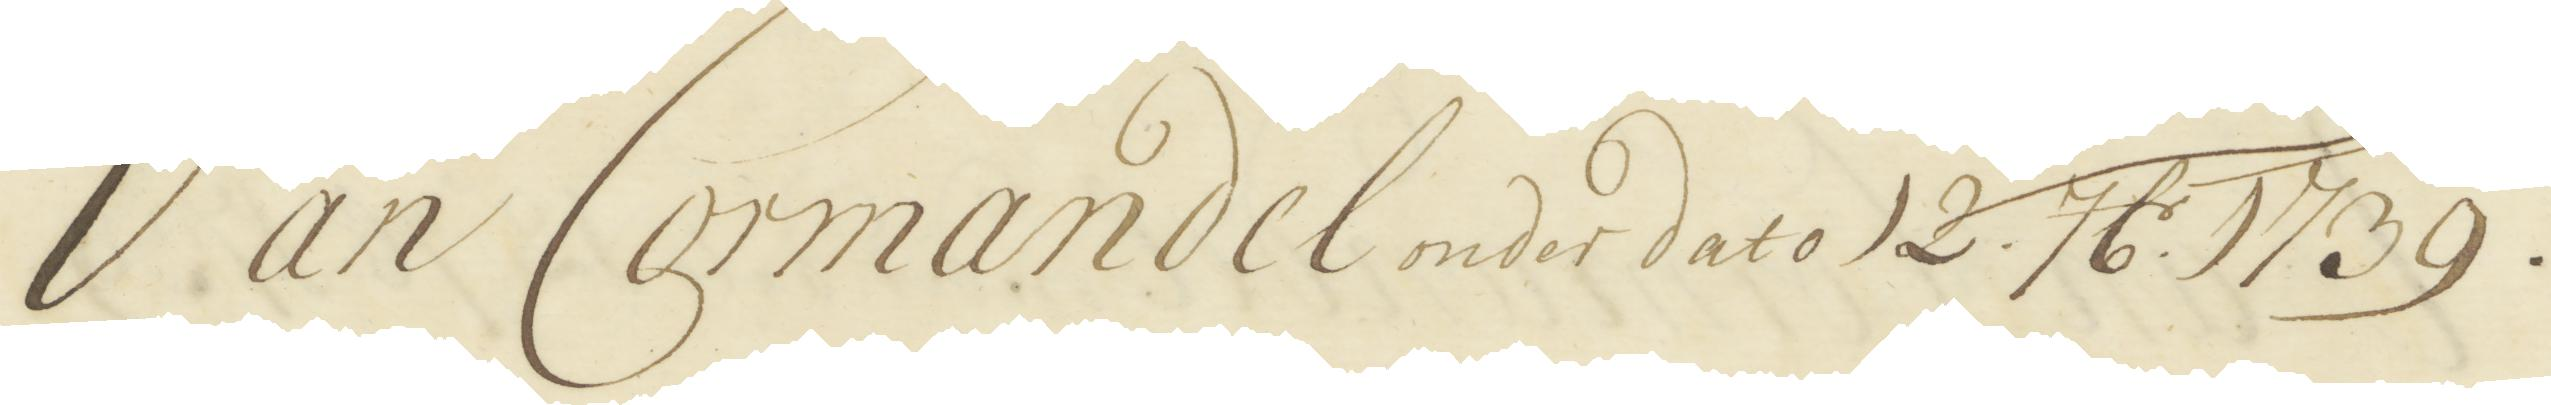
Van Cormandel onder dato 12:e 7b:r 1739.
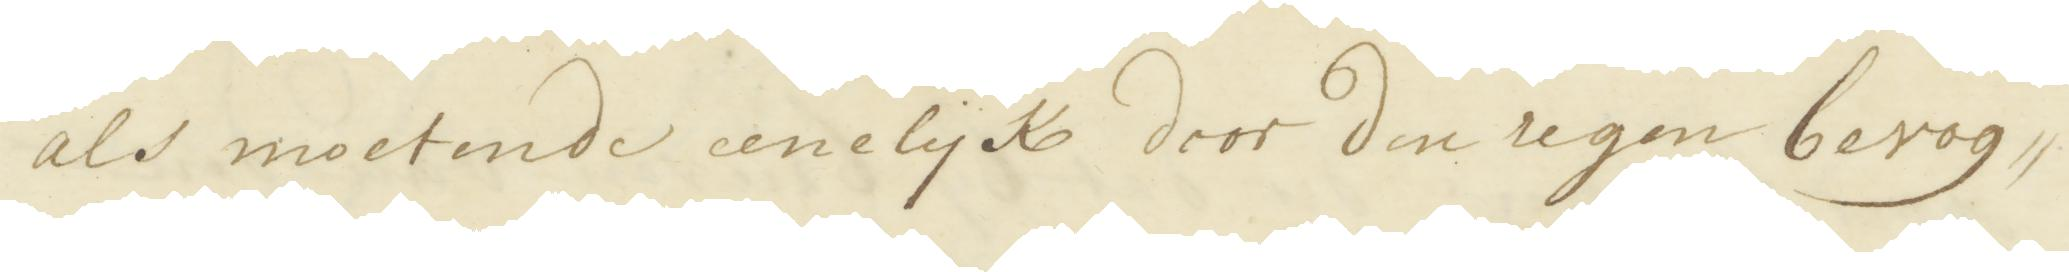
als moetende eenelijk door den regen bevog„
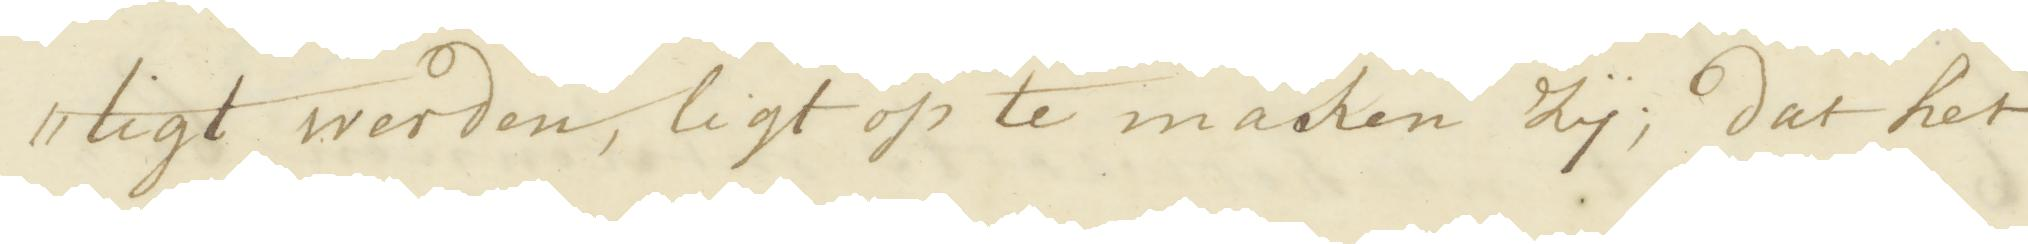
„tigt werden, ligt op te maken zij; dat het
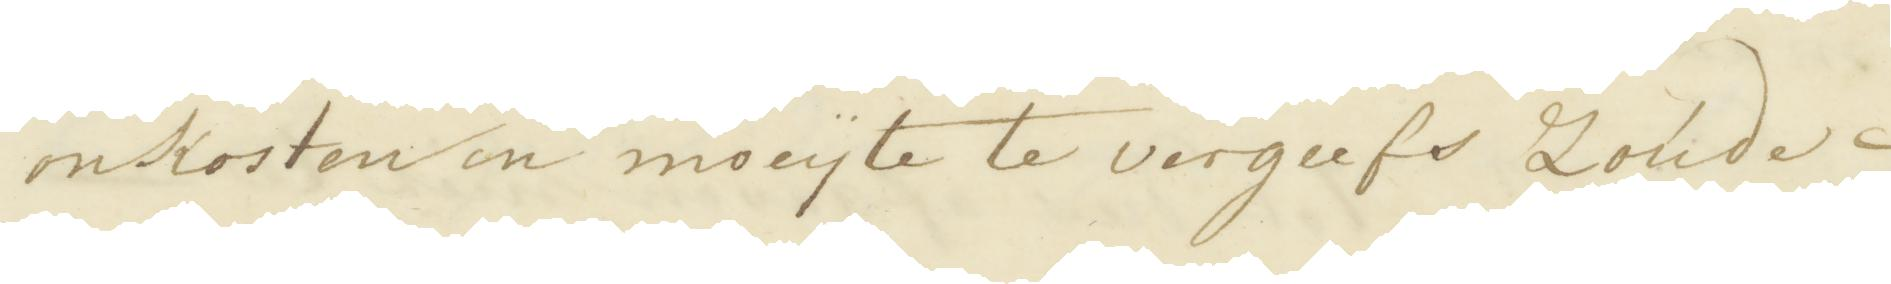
onkosten en moeijte te vergeefs Zoude
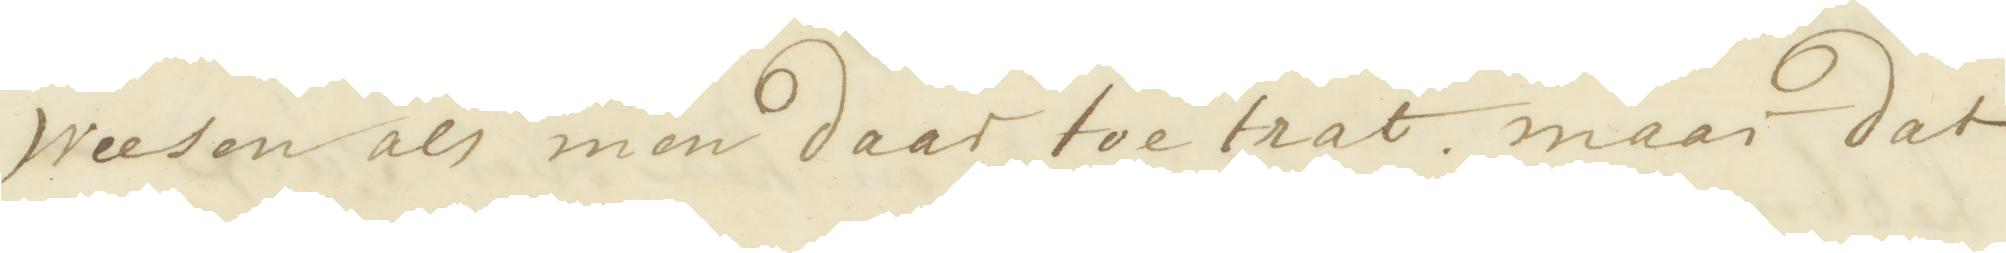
weesen als men daar toe trat maar dat
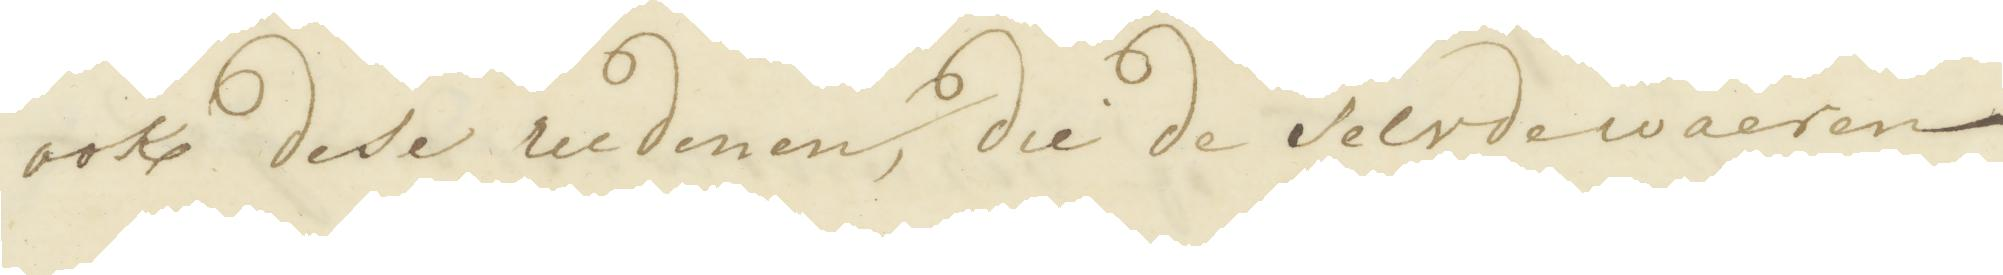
ook dese reedenen, die de selvde waeren
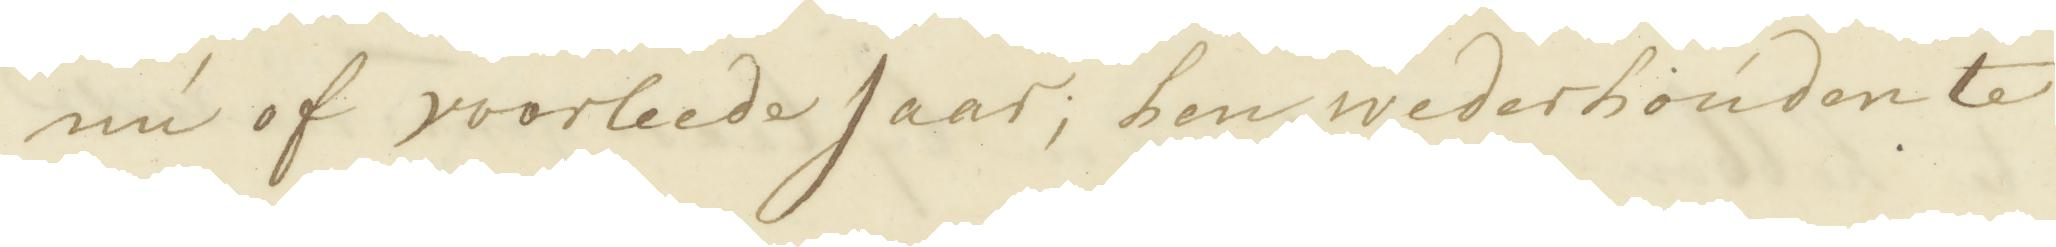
nu of voorleede Jaar; hen wederhouden te
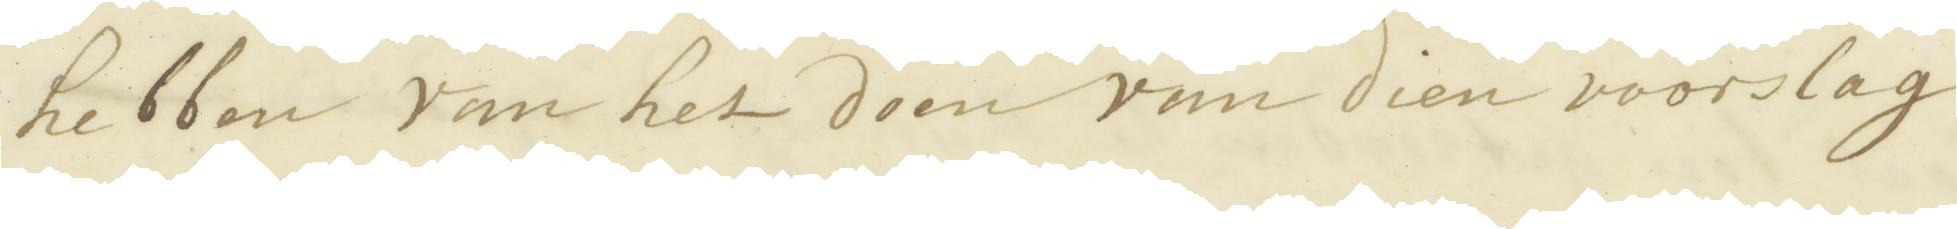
hebben van het doen van dien voorslag
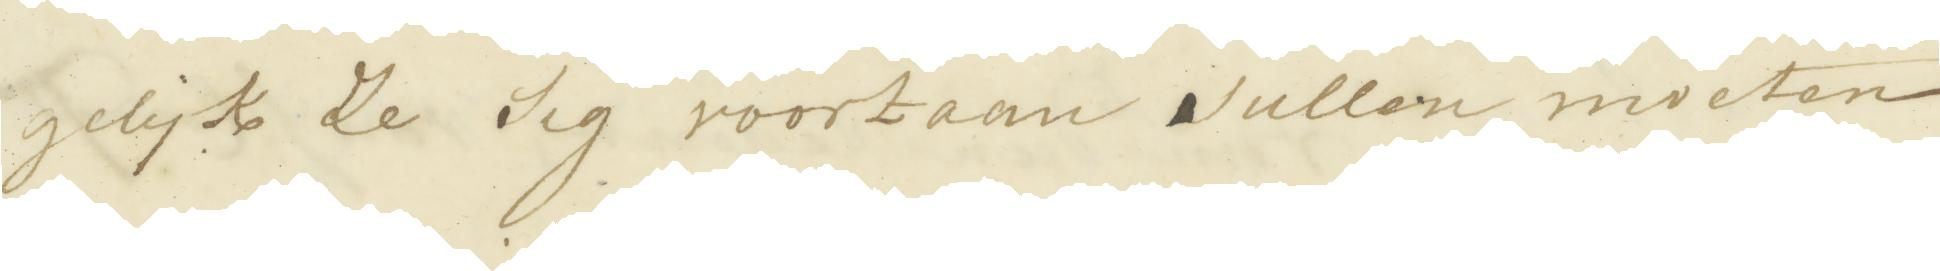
gelijk Ze sig voortaan sullen moeten
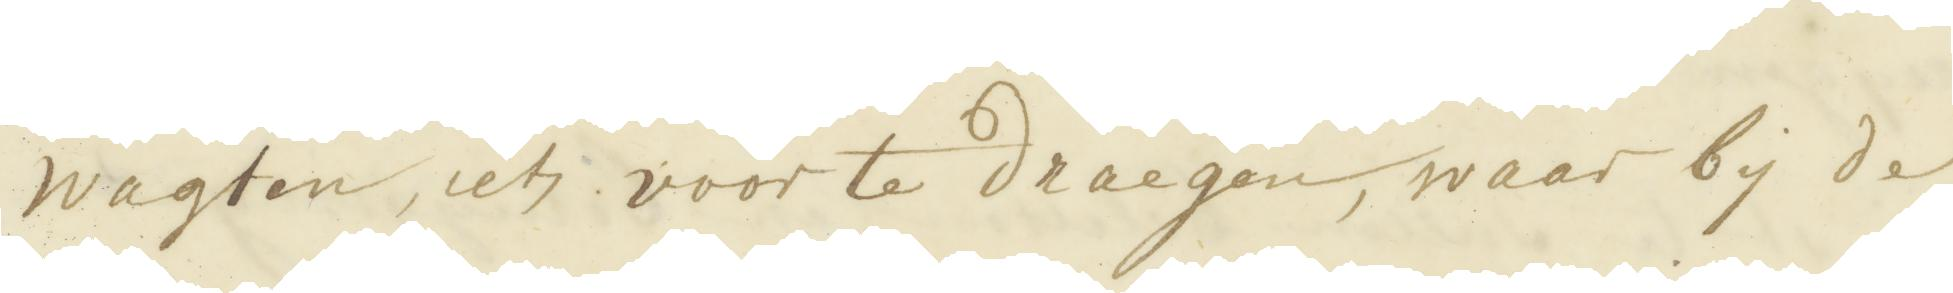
wagten, iets voor te draegen, waar bij de
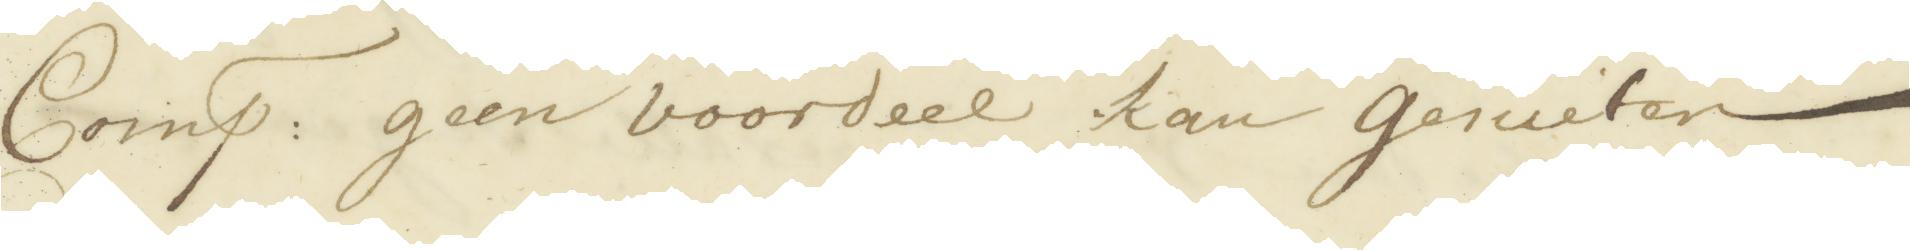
Comp: geen voordeel kan genieten
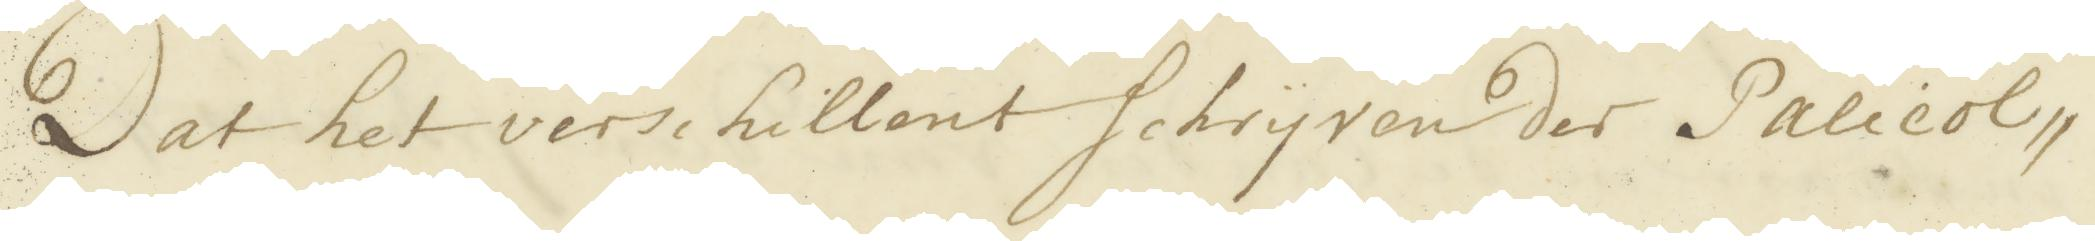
Dat het verschillent Schrijven der Palicol„
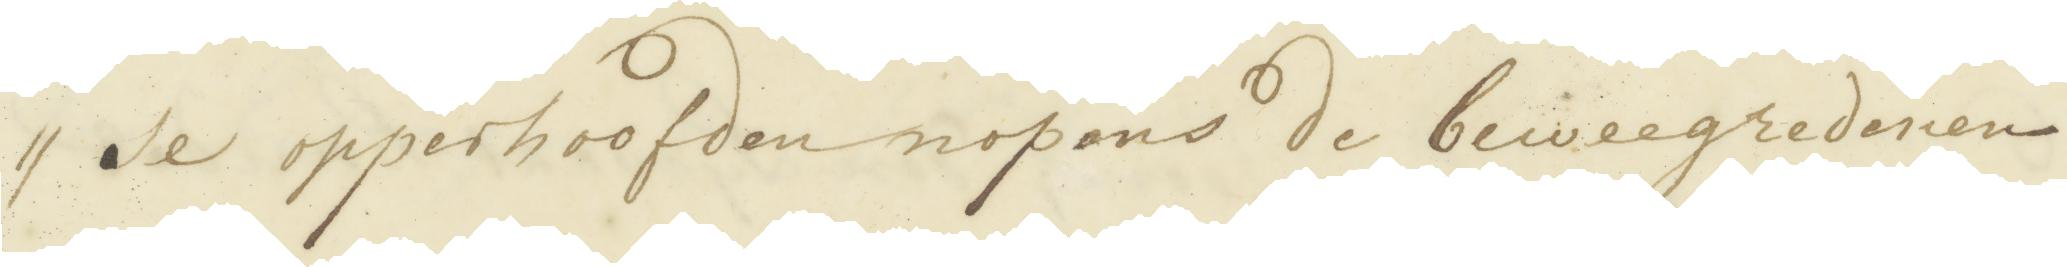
„se opperhoofden nopens de beweegredenen
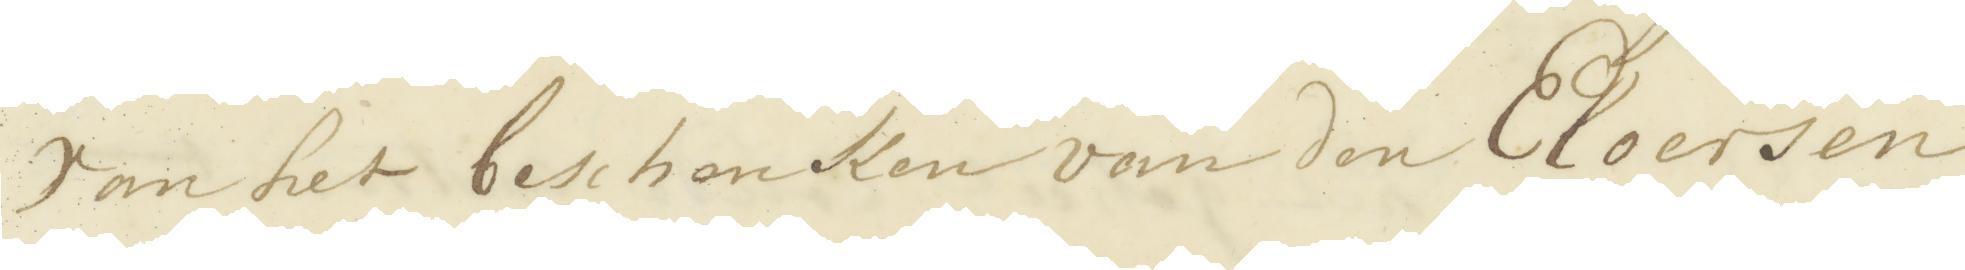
van het beschenken van den Eloersen
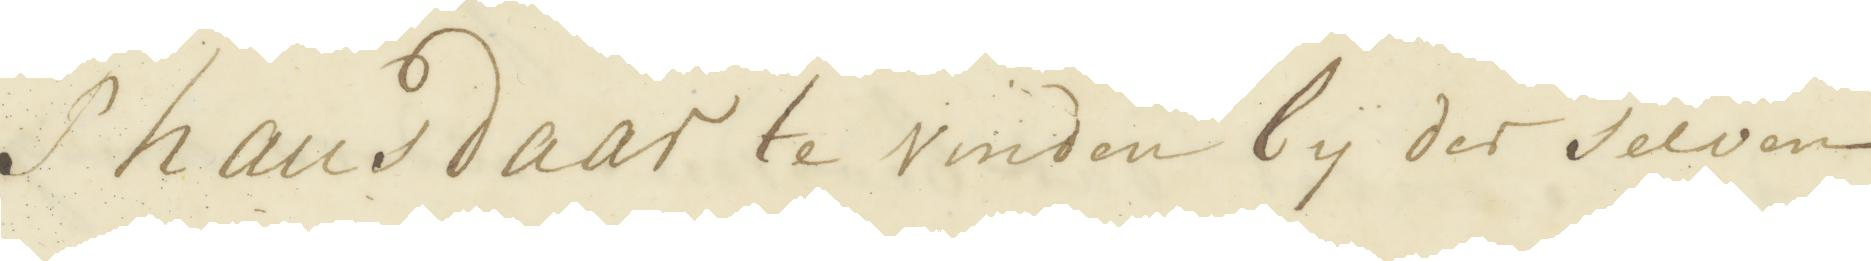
Phausdaar te vinden bij der selven
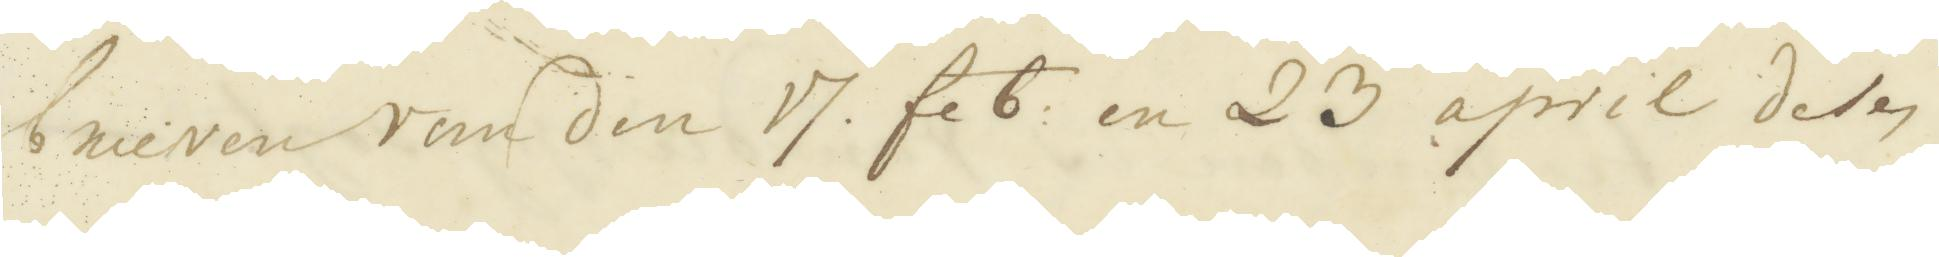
brieven van den 17. feb: en 23 april deses
